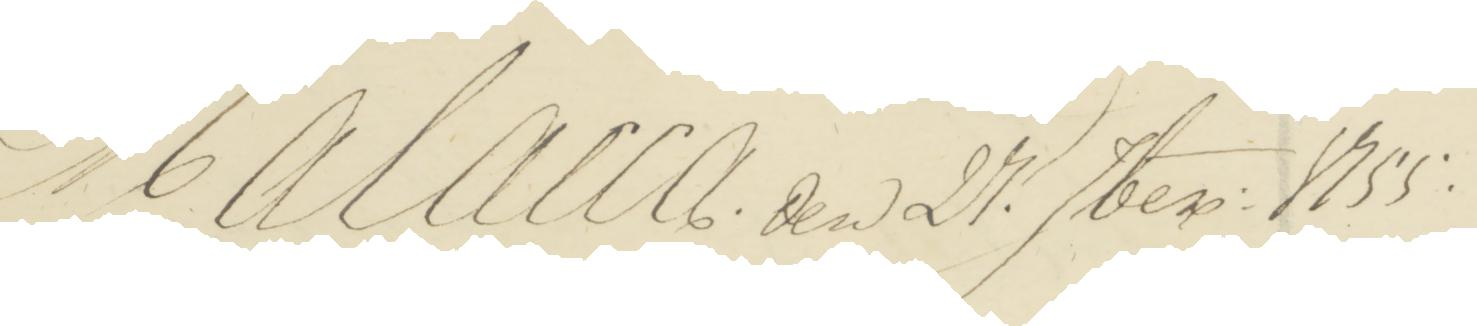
Van Malacca den 27:' 7ber: 1755:
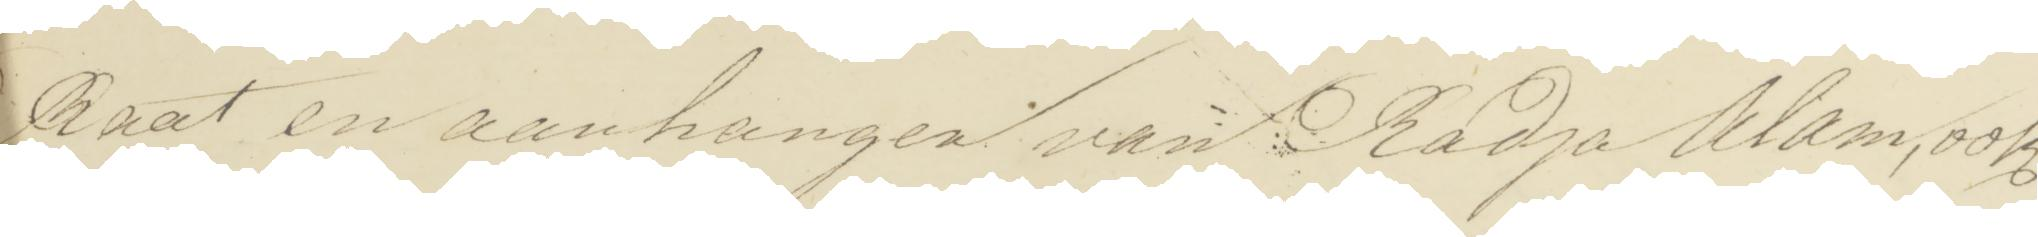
Raat en aanhanger van Radja Alam, ook
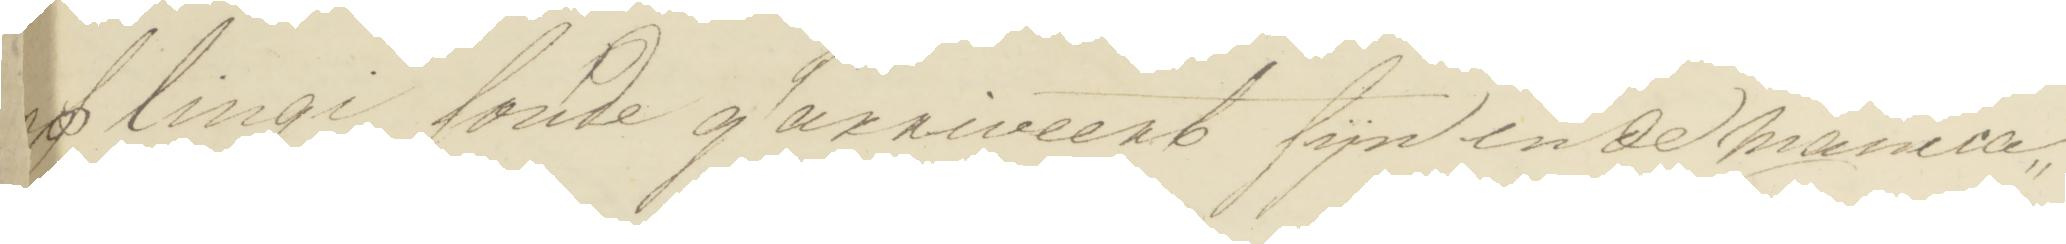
f lingi soude g'arriveert sijn en de manica„
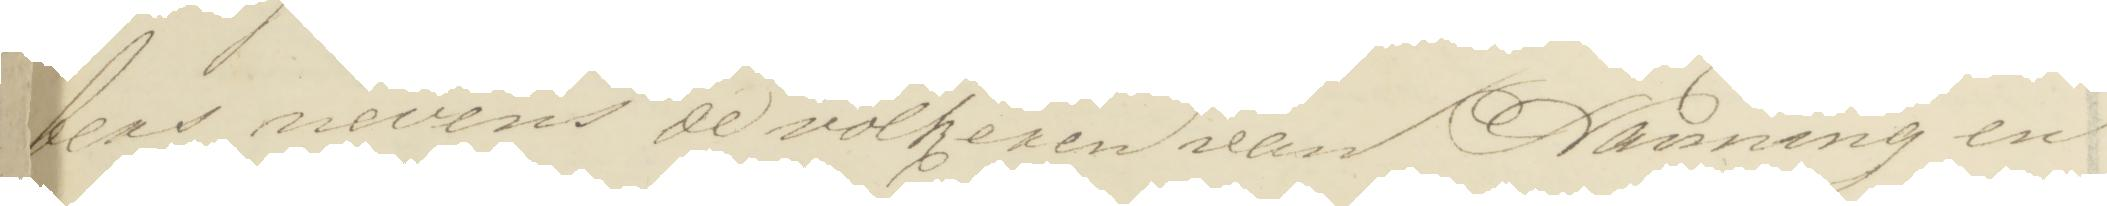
bers nevens de volkeren van Nanning en
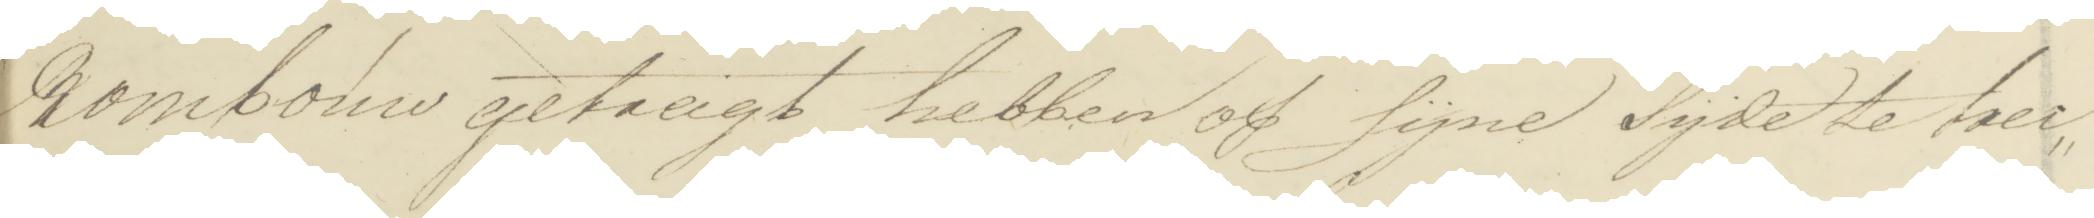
Rombouw getragt hebben op sijne sijde te trec„
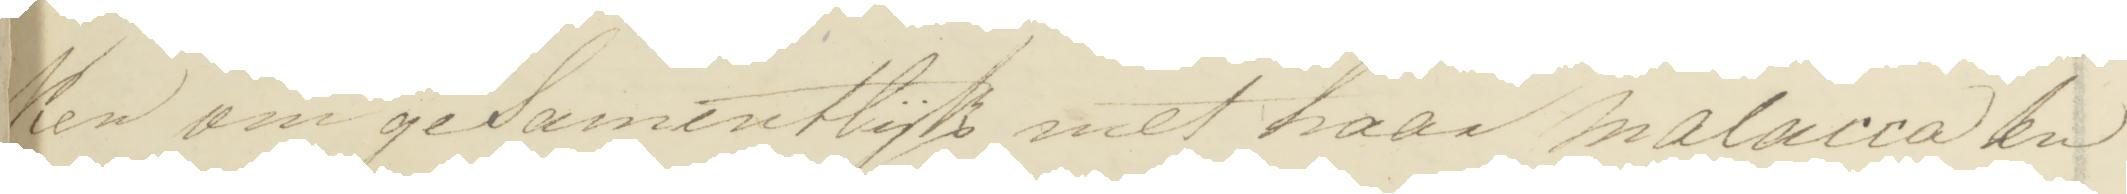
ken om gesamentlijk met haar malacca ten
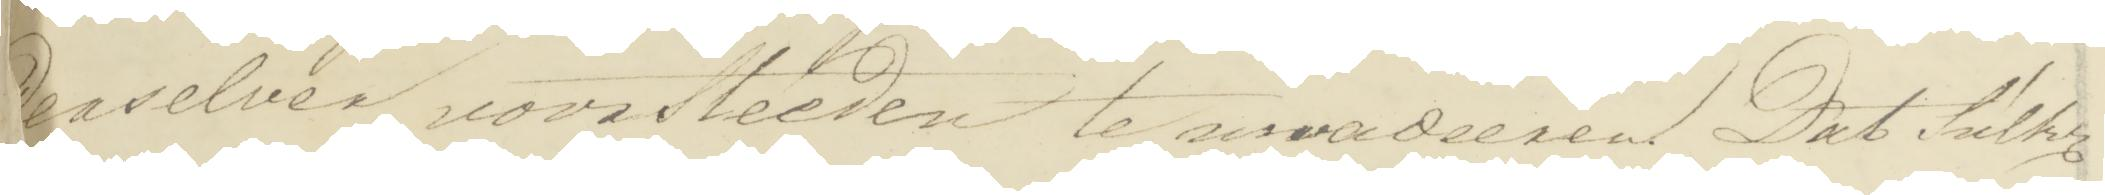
erselver voorsteeden te wadeeren. Dat sulken
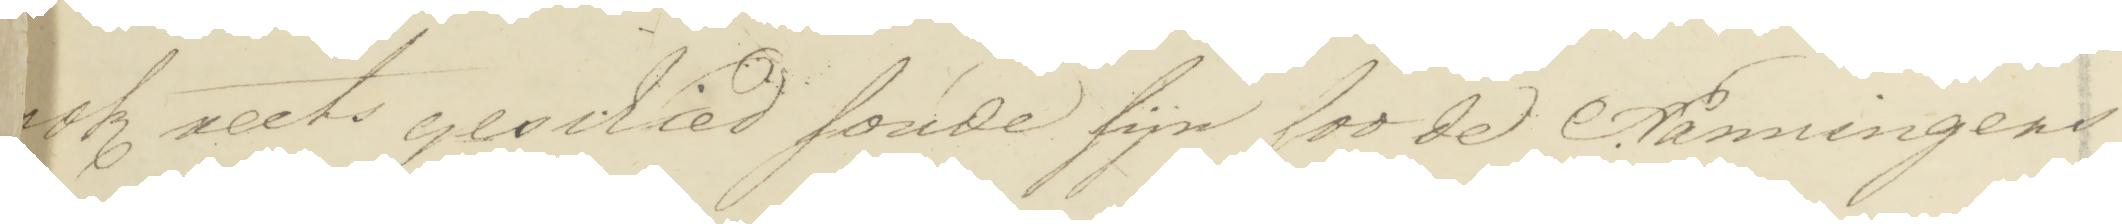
ok reets geschied soude sijn soo de Nanningers
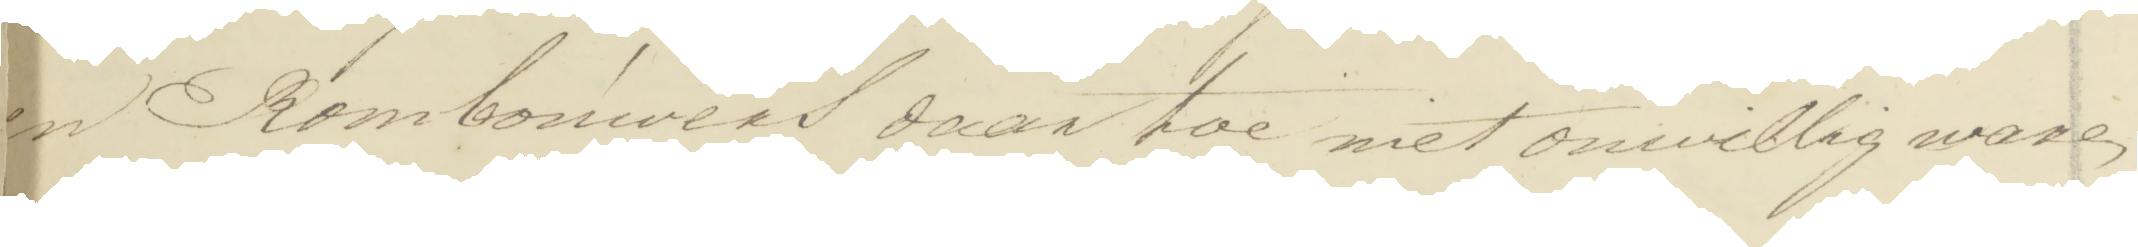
n Rombouwers daar toe niet onwillig waren
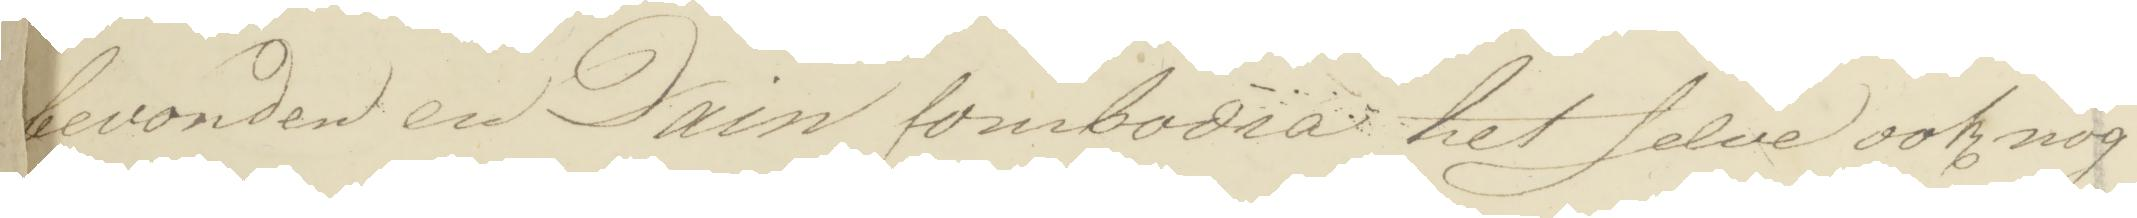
bevonden en Dain Combodia het selve ook nog
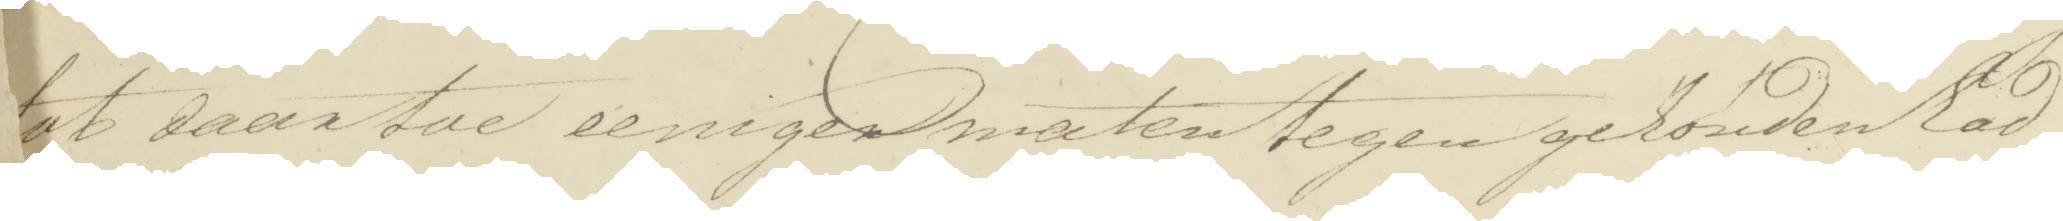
tot daartoe eeniger maten tegen gehouden had
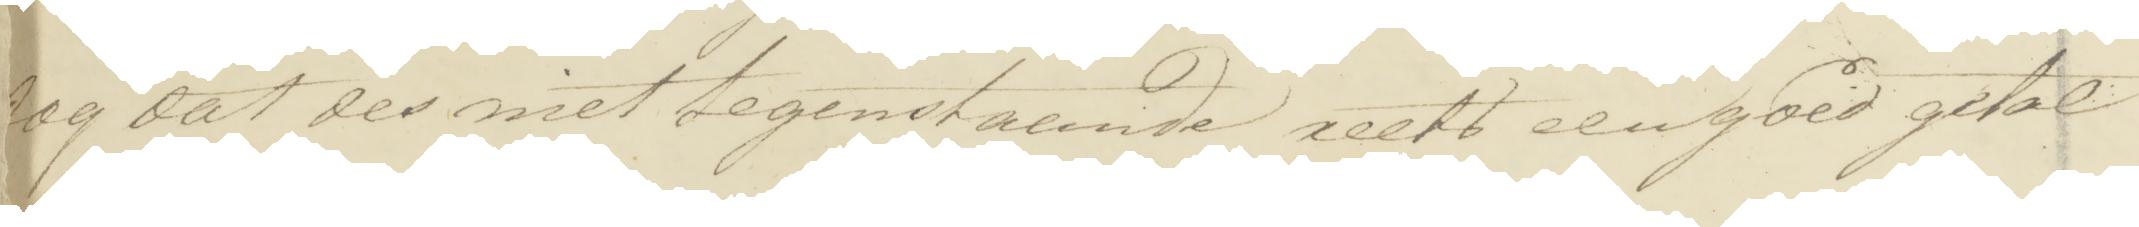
og dat des niet tegenstaande reets een goed getal
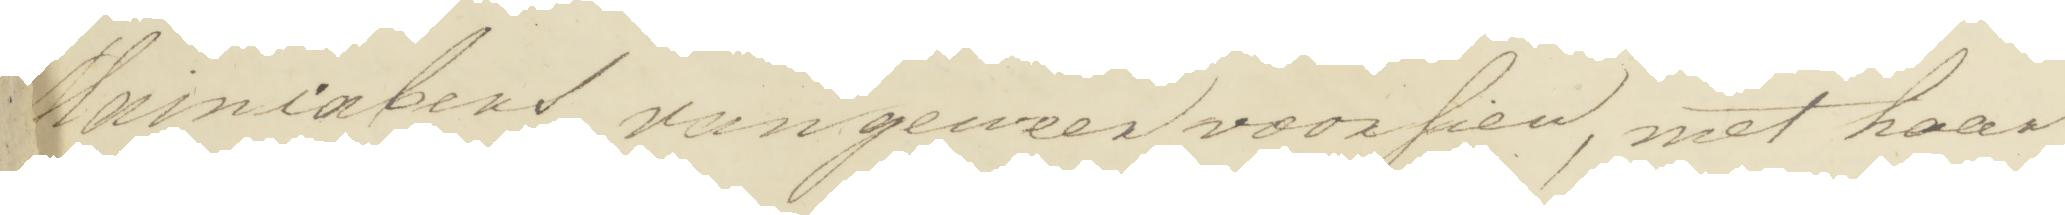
Maincabers, van geweer voorsien, met haar
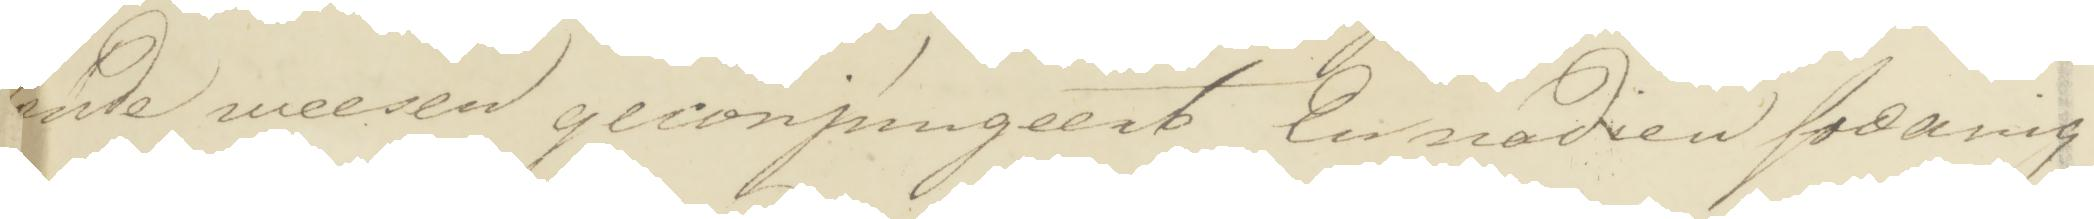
nde weesen geconjungeert En nadien sodanig
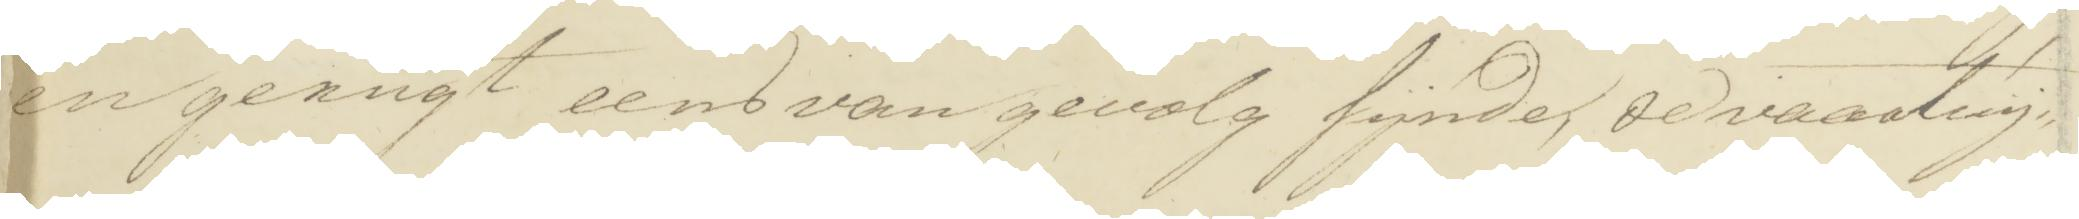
in gerugt eens van gevolg sijnde, de vaartuij„
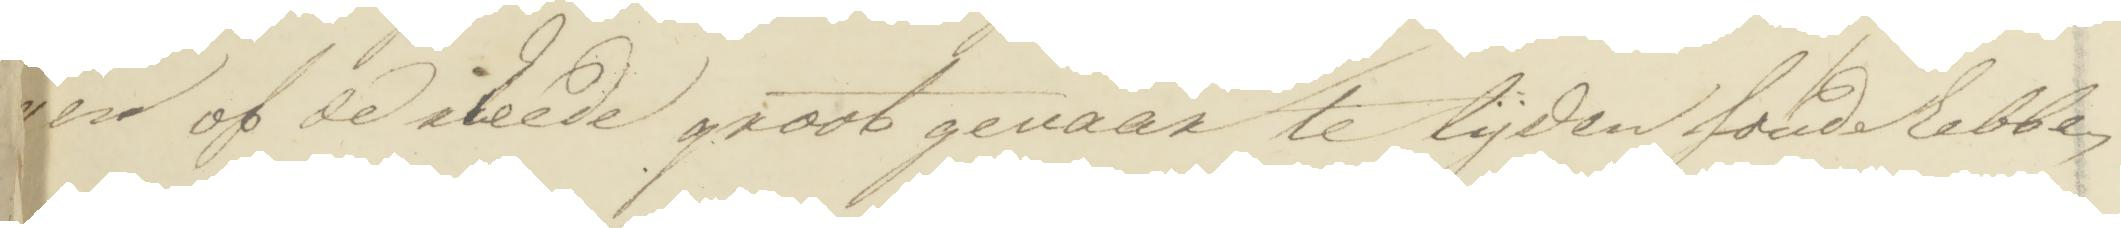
en of de rheede groot gevaar te lijden soude hebben
